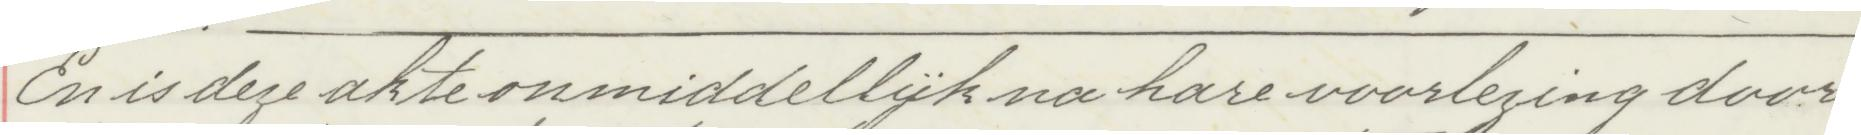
En in deze akte onmiddellijk na hare voorlezing dor
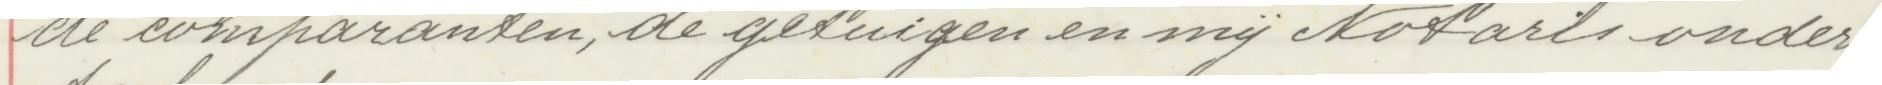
de comparanten, de getuigen en mij Notaris onder-
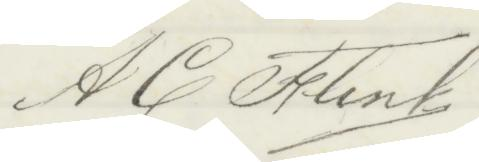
A C Flink
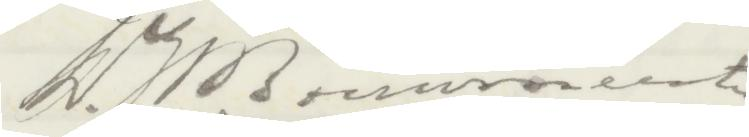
DJWBouwmeester
